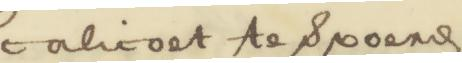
calicoet te vervoeren
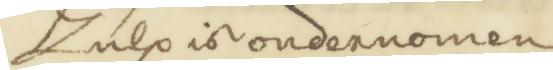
zulx is ondernomen
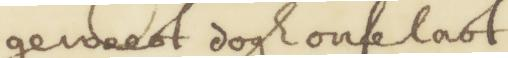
geweest dogh onse last
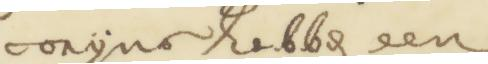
corijns hebben een
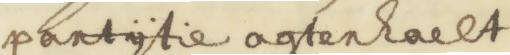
partijtie agterhaelt
